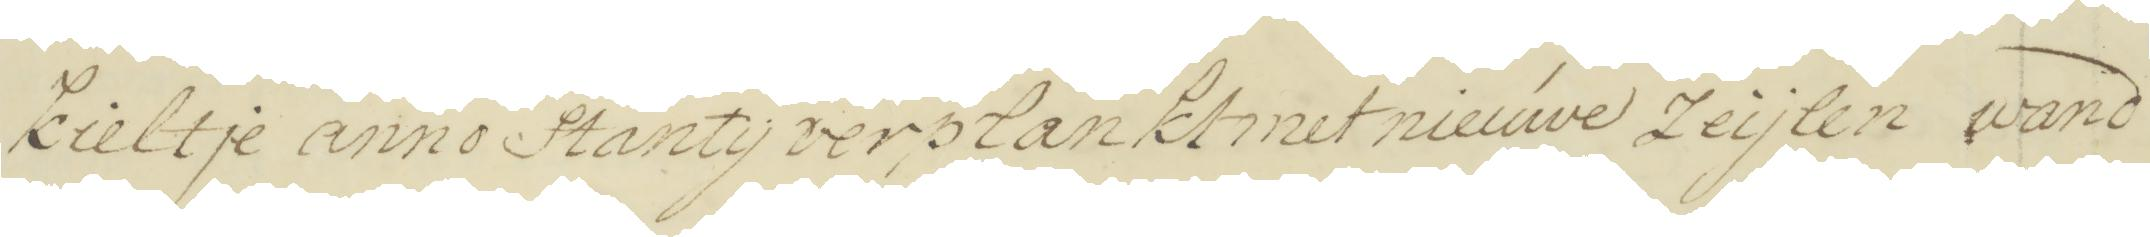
kieltje anno stantij verplankt met nieuwe zeijlen wand
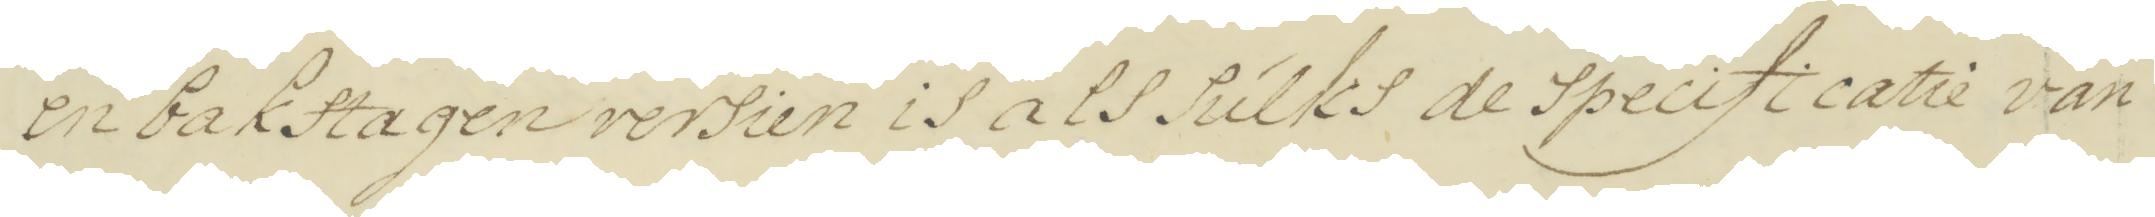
en bakstagen versien is als sulks de specificatie van
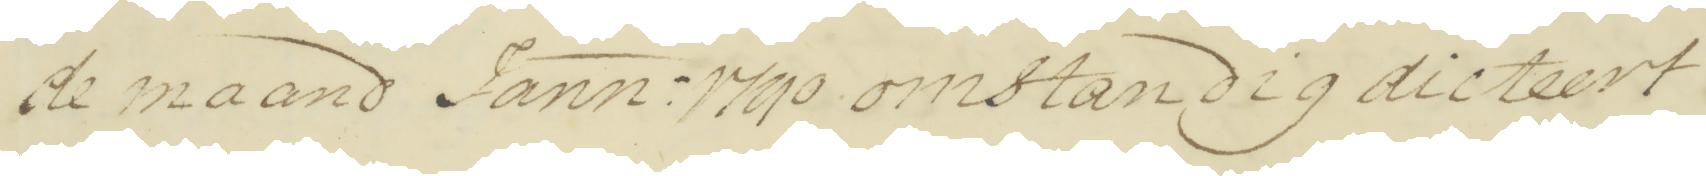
de maand Iann: 1740. omstandig dicteert
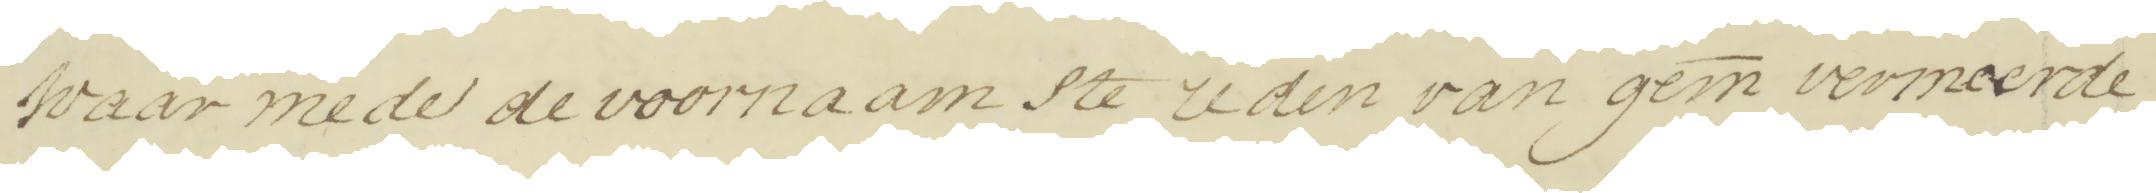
waar mede de voornaamste reden van gem vermeerde
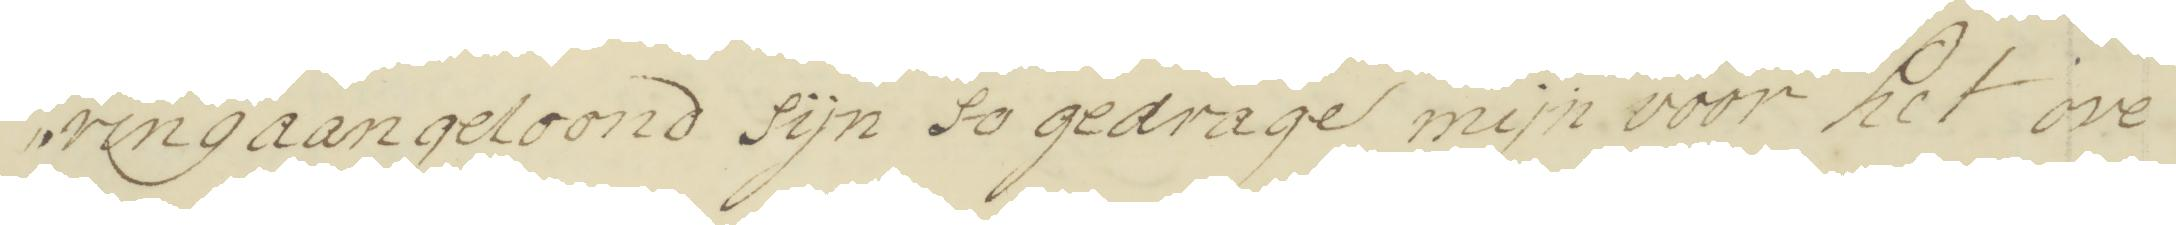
„ring aangetoond sijn so gedrage mijn voor het ove
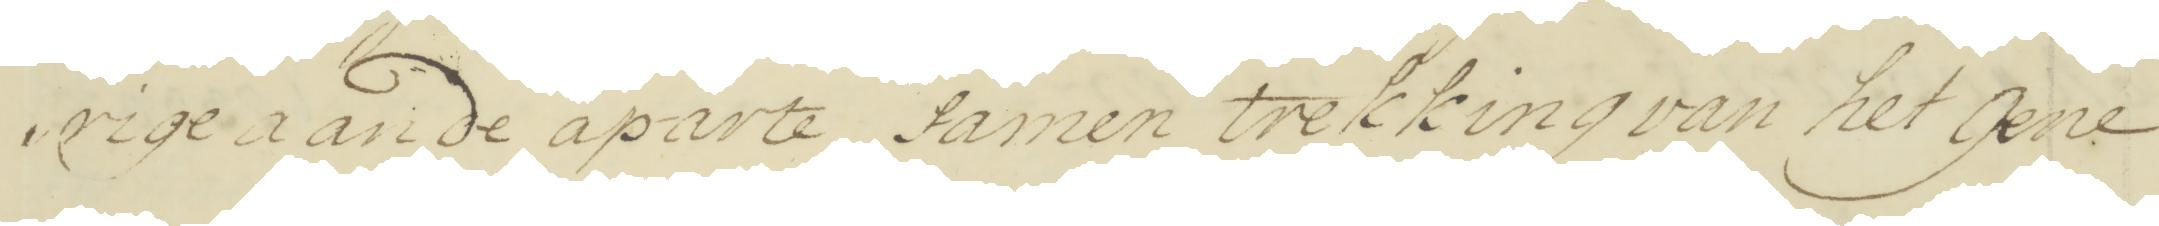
„rige aan de aparte samen trekking van het gene
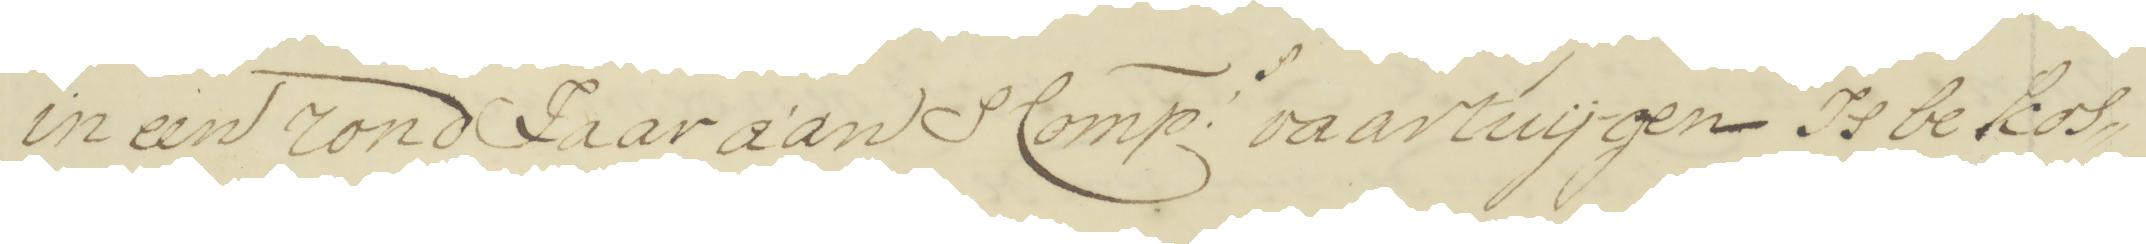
in een rond Iaar aan s Comp:s vaartuijgen is be kos„
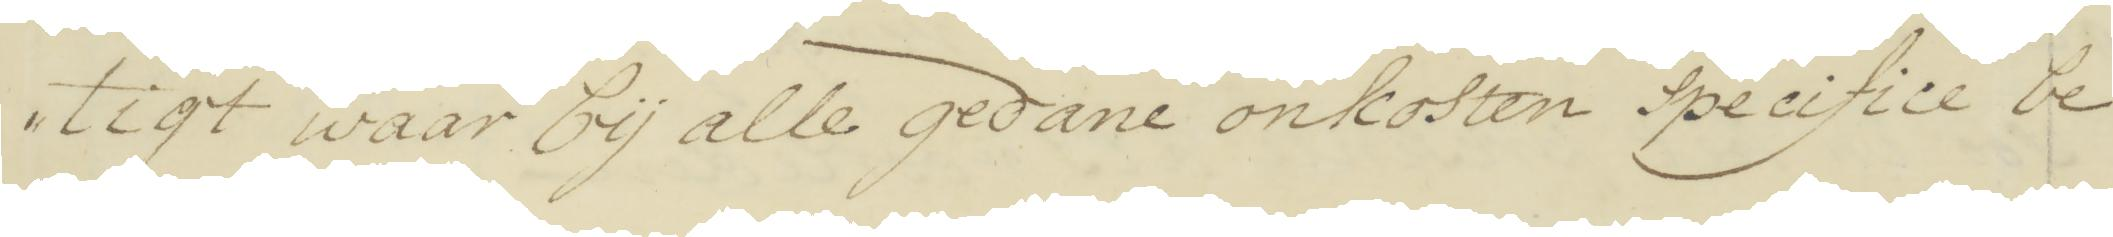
„tigt waar bij alle gedane onkosten specifice be
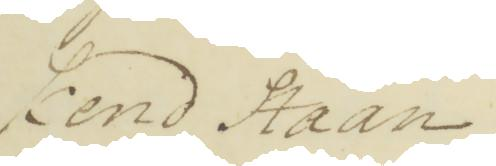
kend staan
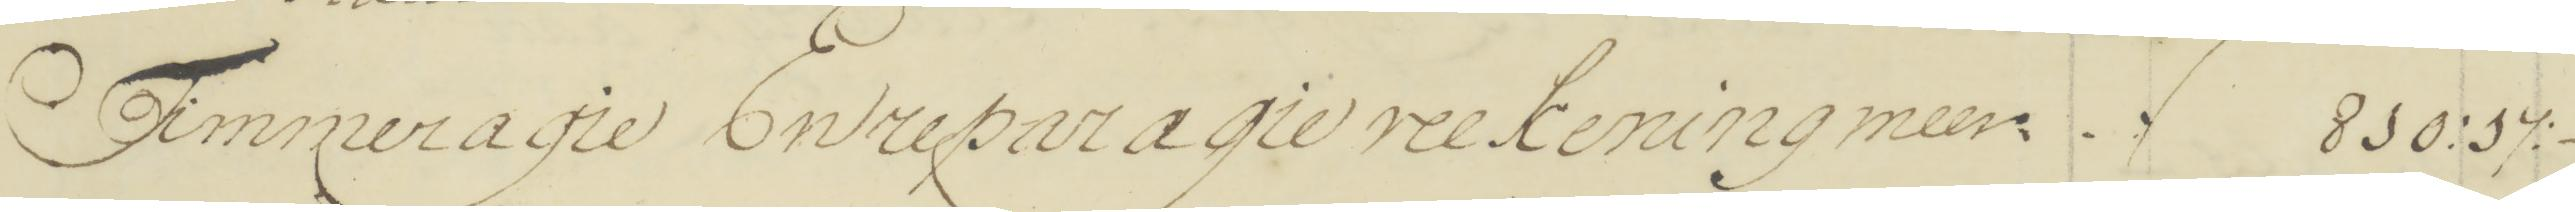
Timmeragie En reparagie reekening meer - ƒ 810:17:
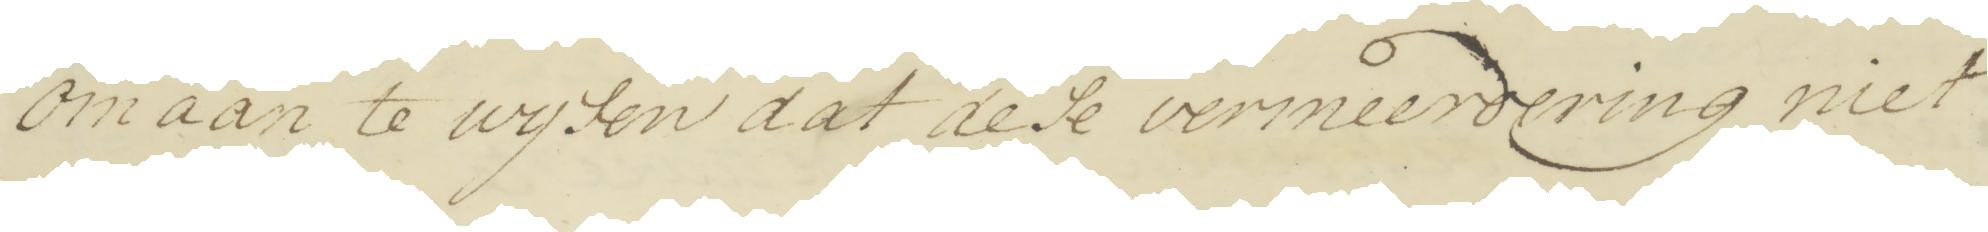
om aan te wysen dat dese vermeerdering niet
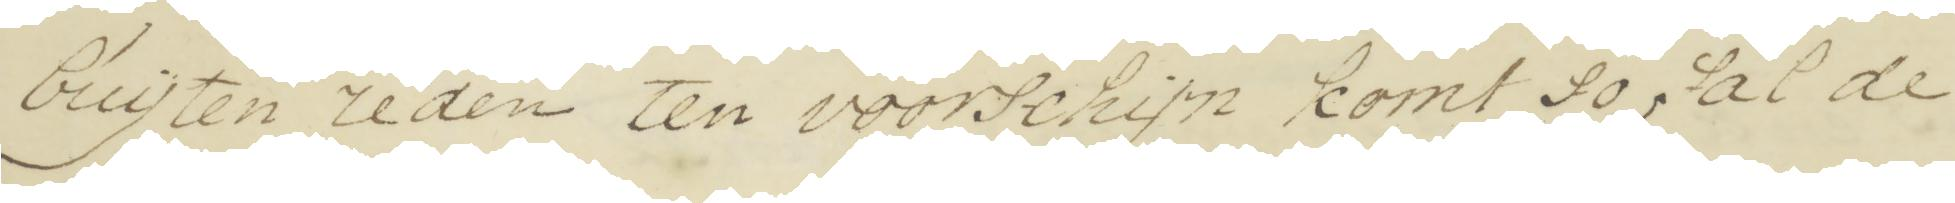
buijten reden ten voorschijn komt so sal de
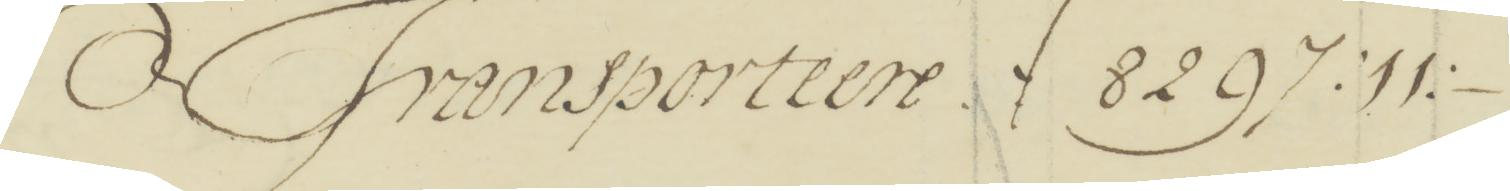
Transporteere ƒ 8297:11:—
